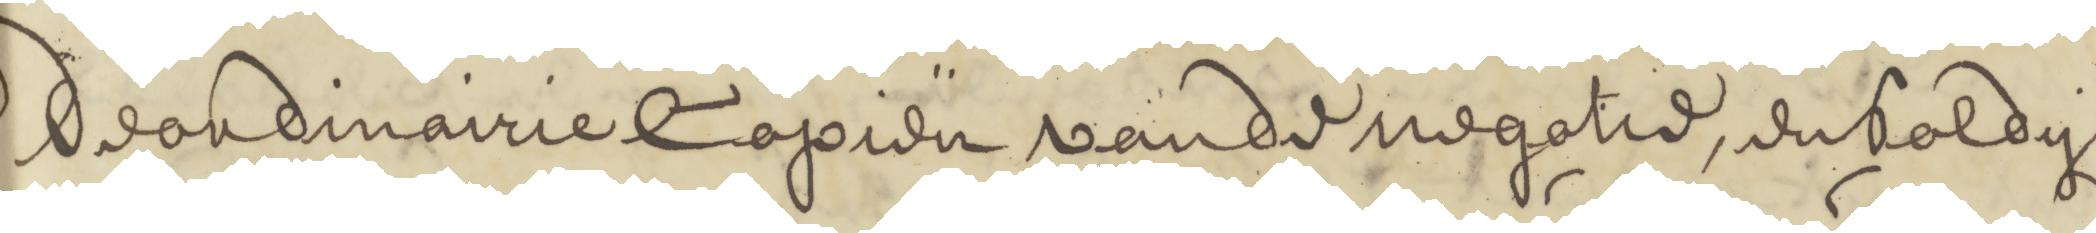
de ordinairie Copiën vande negotie, en soldij
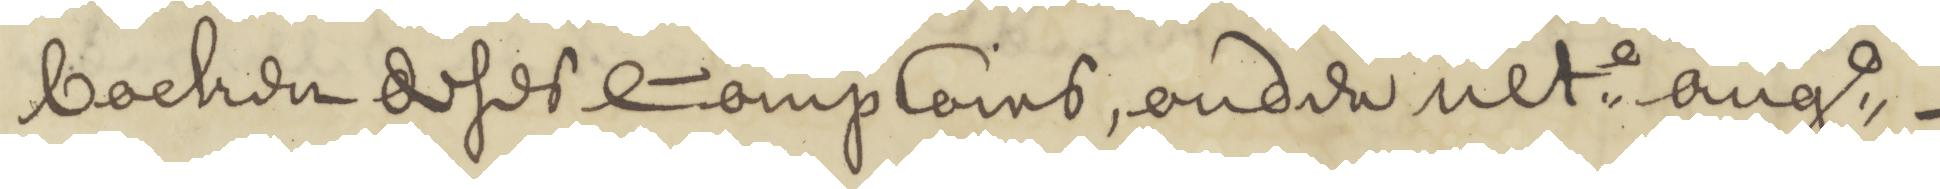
boeken deses Comptoirs, onder ult„o aug„o —
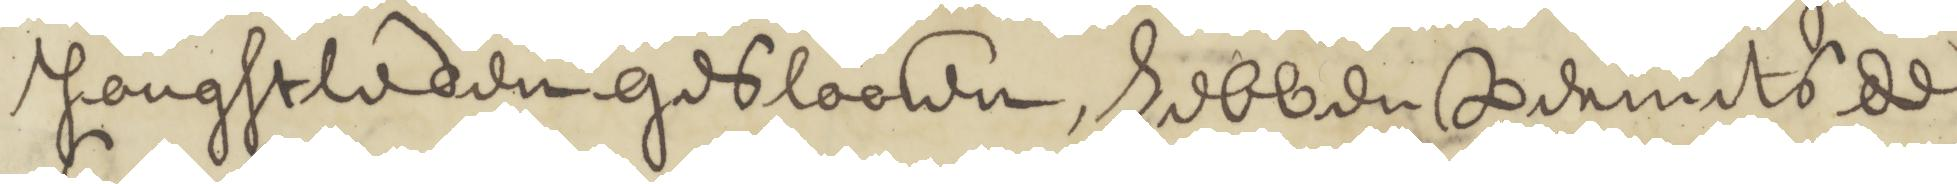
Jongstleden geslooten, hebben vermits de
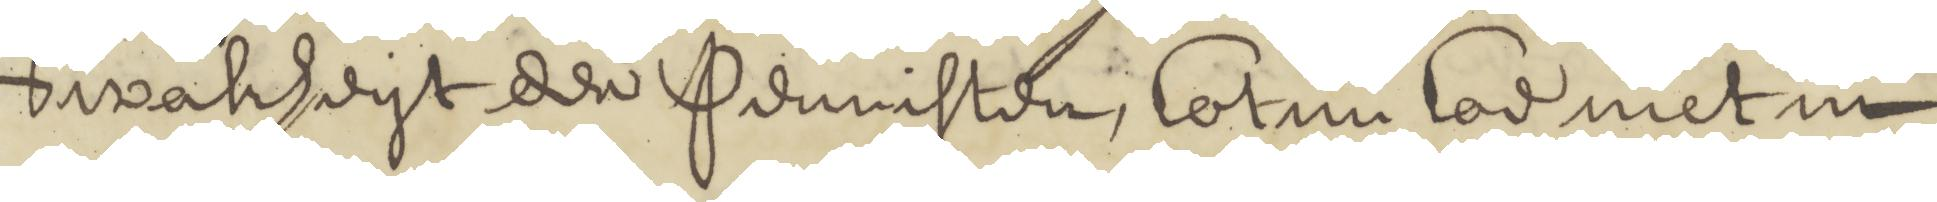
swakheijt der Pennisten, tot nu toe niet in
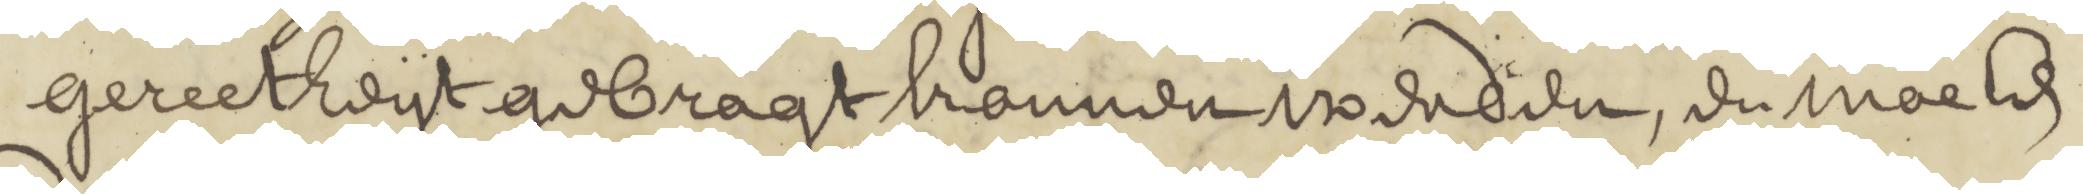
gereetheijt gebragt konnen werden, en moeten
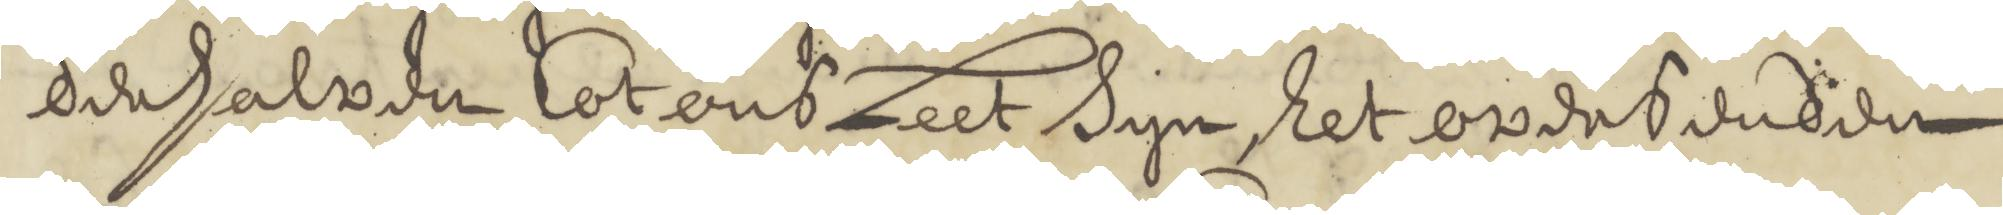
derhalven tot ons Leet sijn, het oversenden
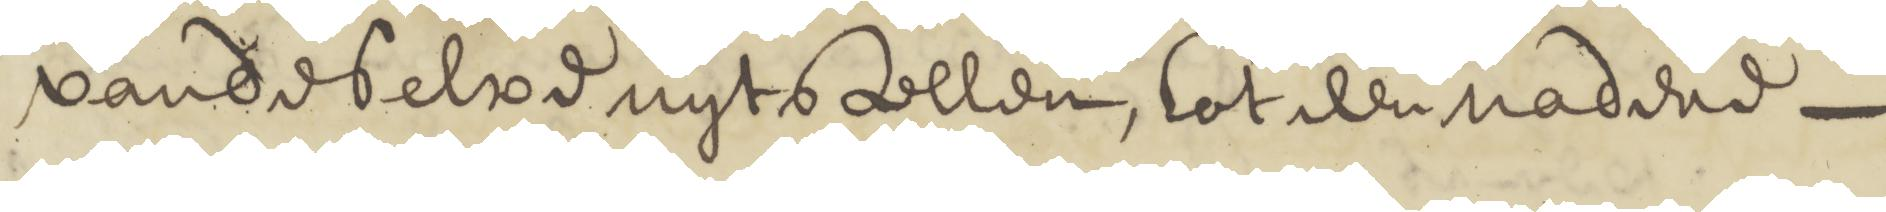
vandeselve uijtstellen, tot een nadere —
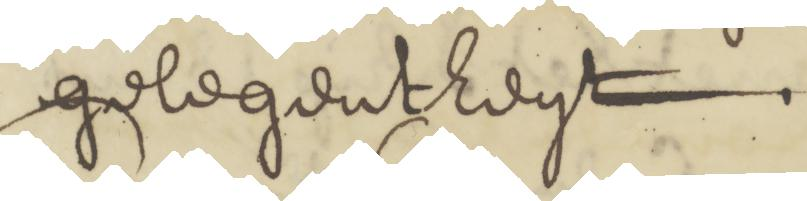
gelegentheyt.
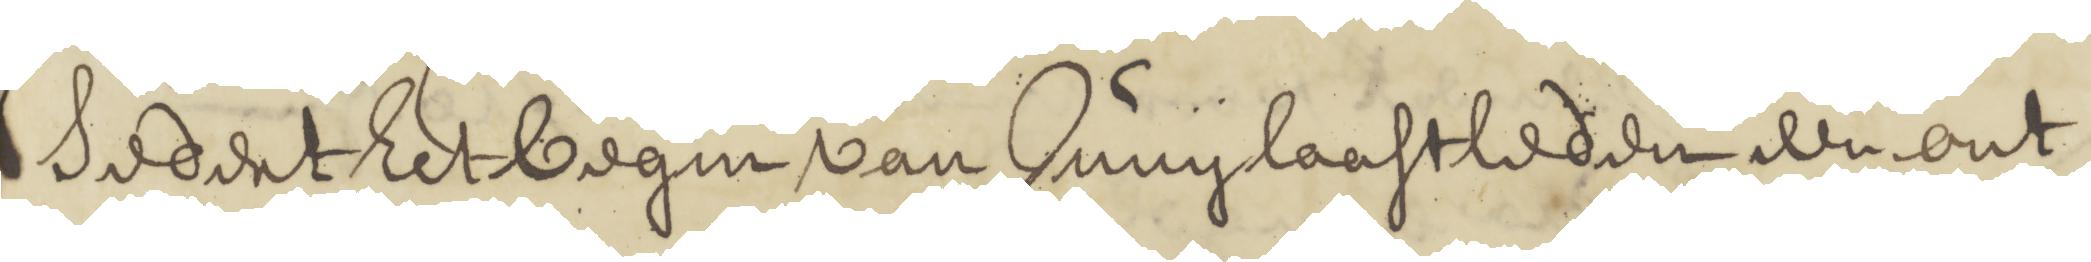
tsedert het begin van Junij laastleden een ont
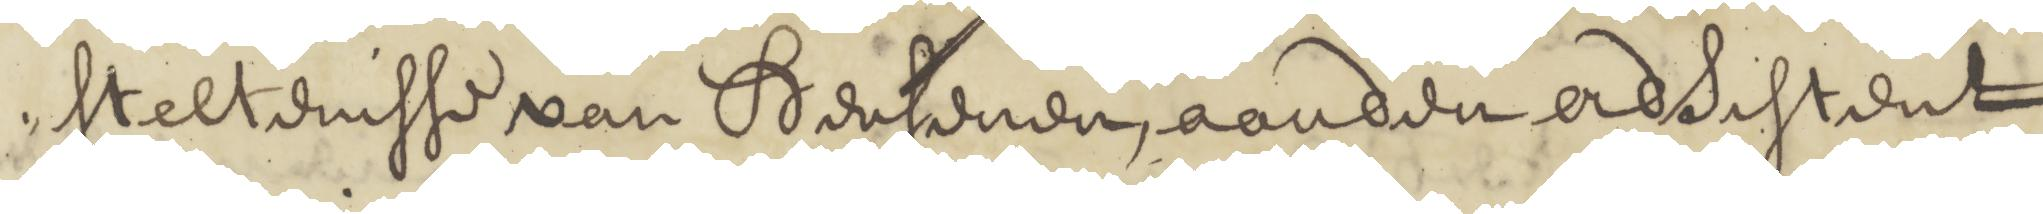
„steltenisse van Hersenen, aanden adsistent
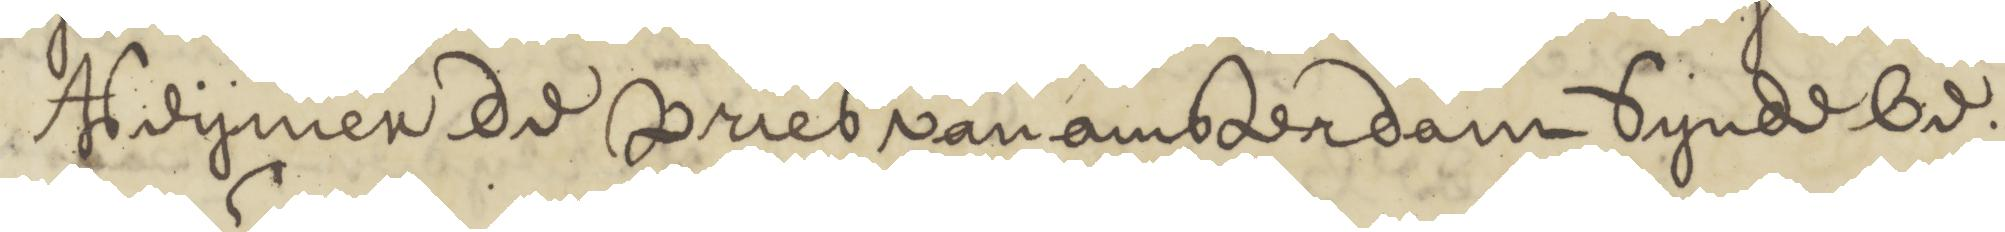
Reijnier de vries van amsterdam sijnde be.
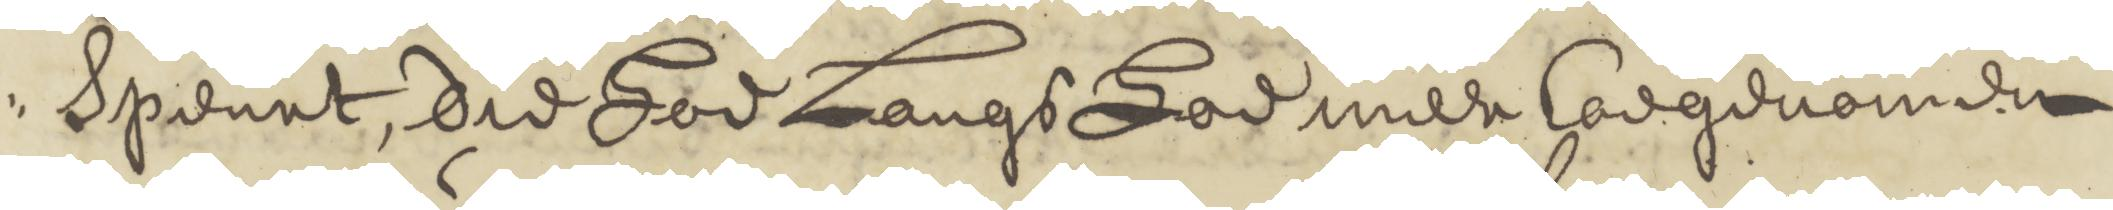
„speurt, die hoe Langs hoe meer toegenomen
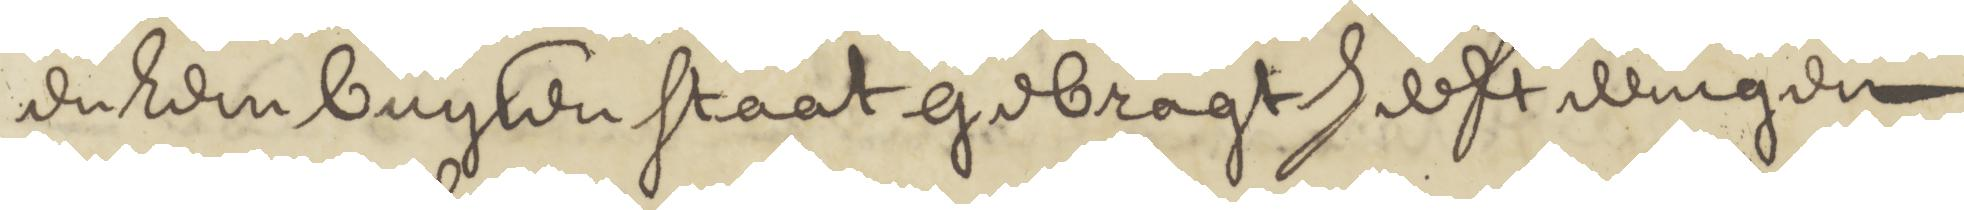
en hem buijten staat gebragt heeft eenigen
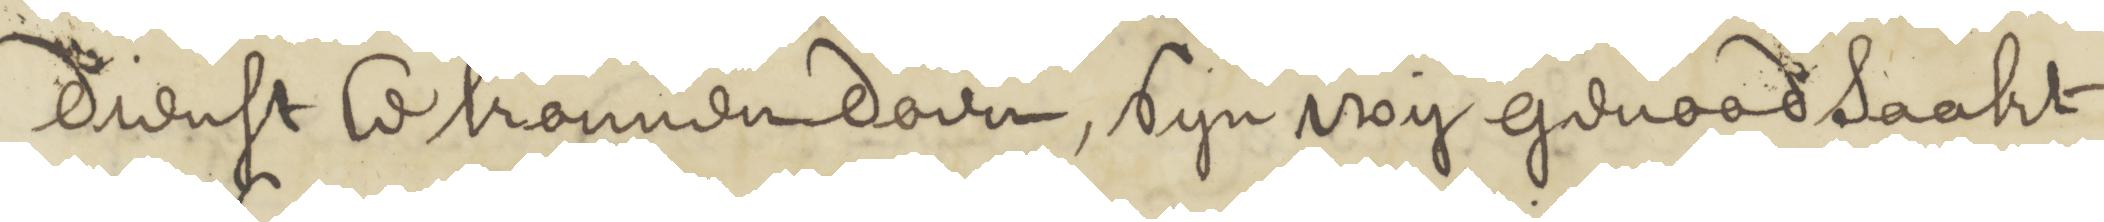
dienst te konnen doen, sijn wij genoodsaakt
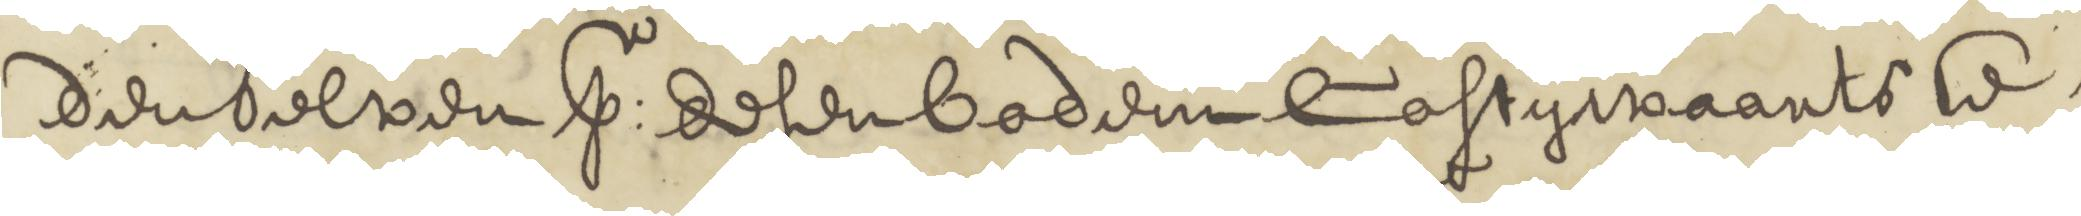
denselven p:r desen bodem Costijwaarts te
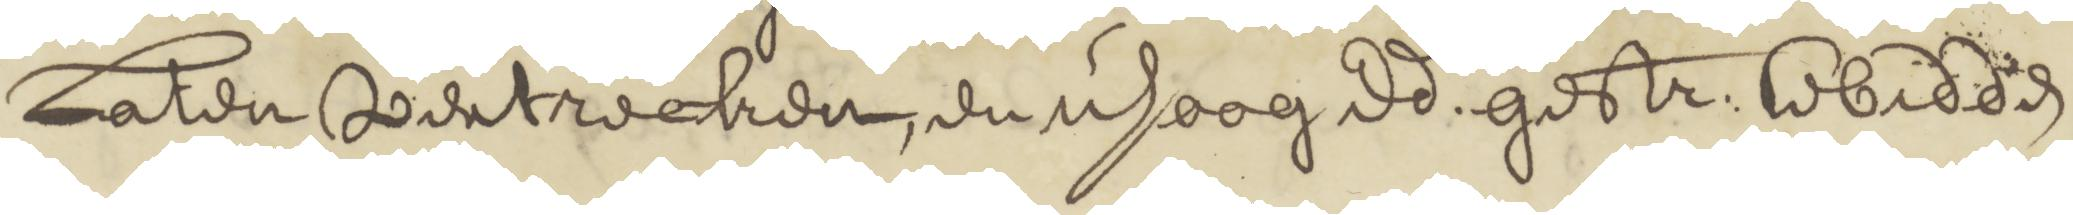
Laten vertrecken, en uhoog Ed:e gestr: tebidden
